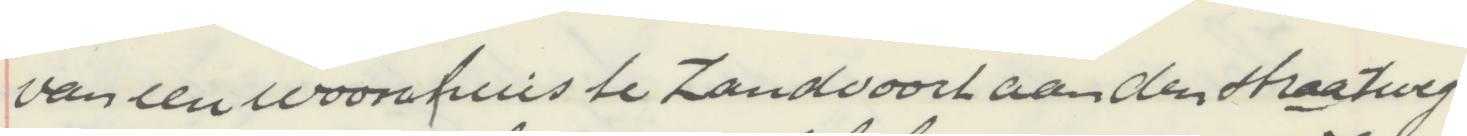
van een woonhuis te Zandvoort aan den straatweg
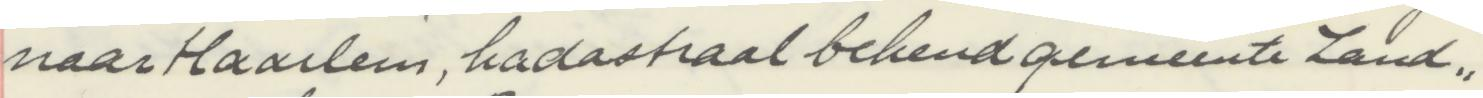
naar Haarlem, kadastraal bekend gemeente zand„
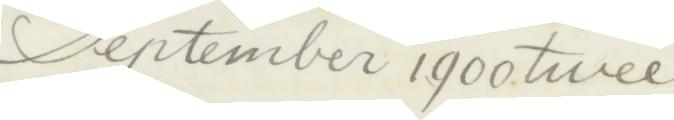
September 1900twee deel
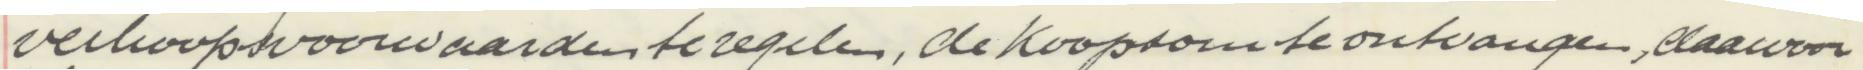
verkoopsvoorwaarden te regelen, de koopsom te ontvangen, daarvoor
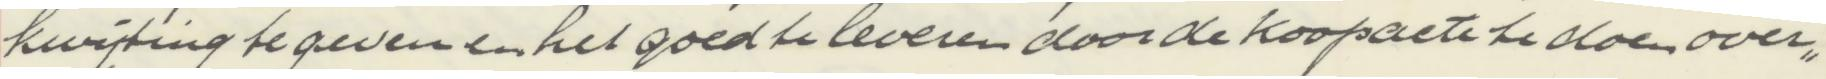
kwijting te geven en het goed te leveren door de koopacle te doen over„
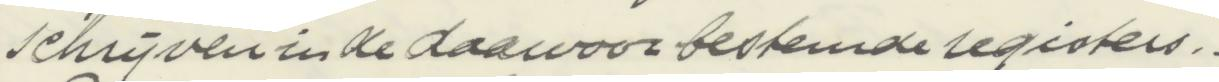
schrijven in de daarvoor bestemde registers.
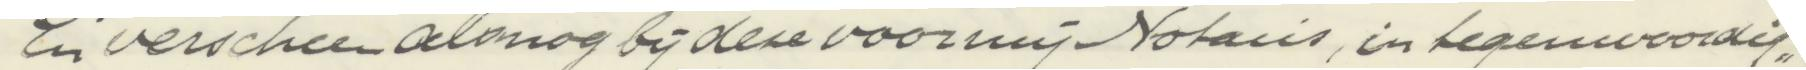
En verscheen als nog bij deze voor mij Notaris, in tegenwoordig„
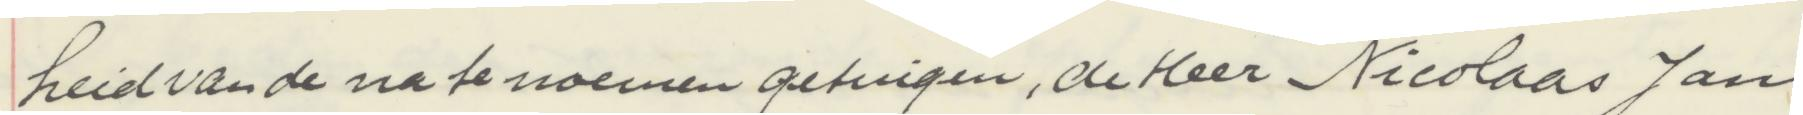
heid van de na te noemen getuigen, de Heer Nicolaas Jan
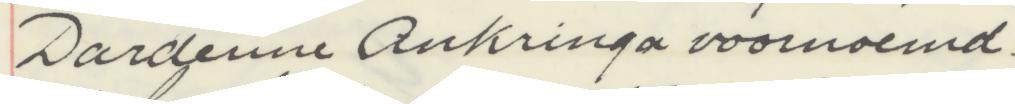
Dardenne Ankringa voornoemd.
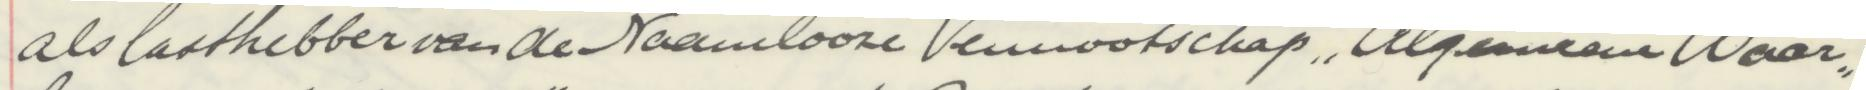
als lasthebber van de Naamlooze Vennootschap, Algemeen Waar„
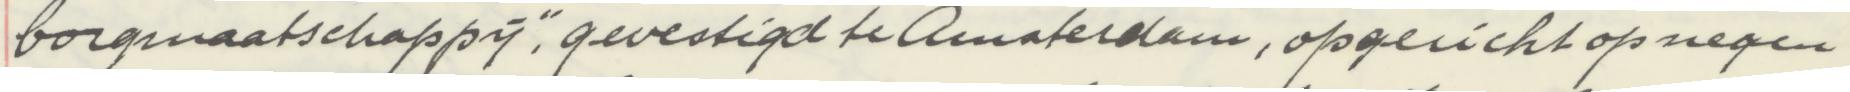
borgmaatschappij, gevestigd te Amsterdam, opgericht op negen
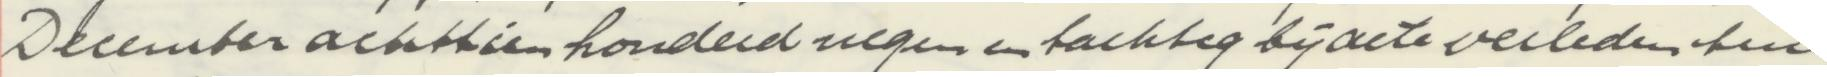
December achttien honderd negen en tachtig bij acte verleden ten
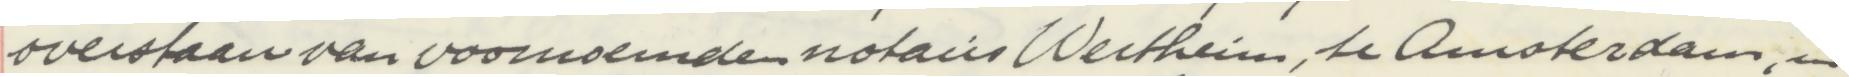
overstaan van voornoemde notaris Wertheim, te Amsterdam, en
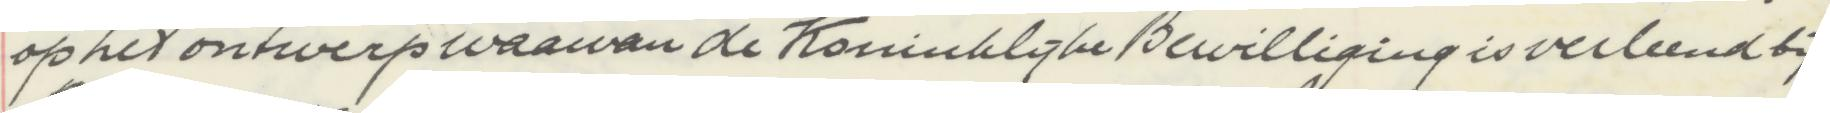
op het ontwerp waarvan de Koninklijke Bewilliging is verleend bij
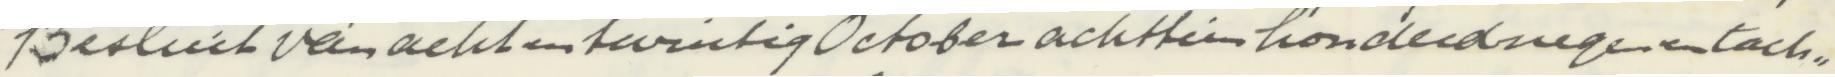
Besluit van acht en twintig October achttien honderdnegen en tach„
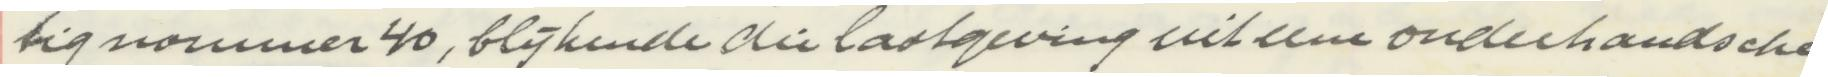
tig nommer 10, blijkende die lastgeving uit eene onderhandsche
